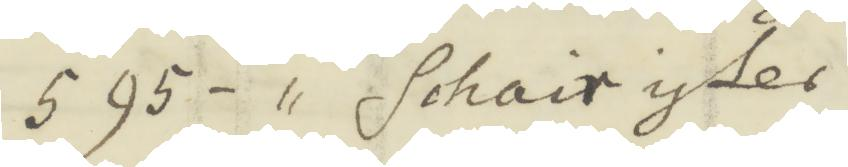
595 - „ Schair ijser
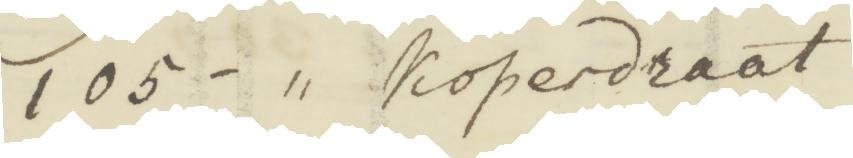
105 - „ koperdraat
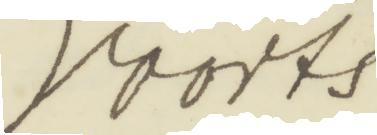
orts
